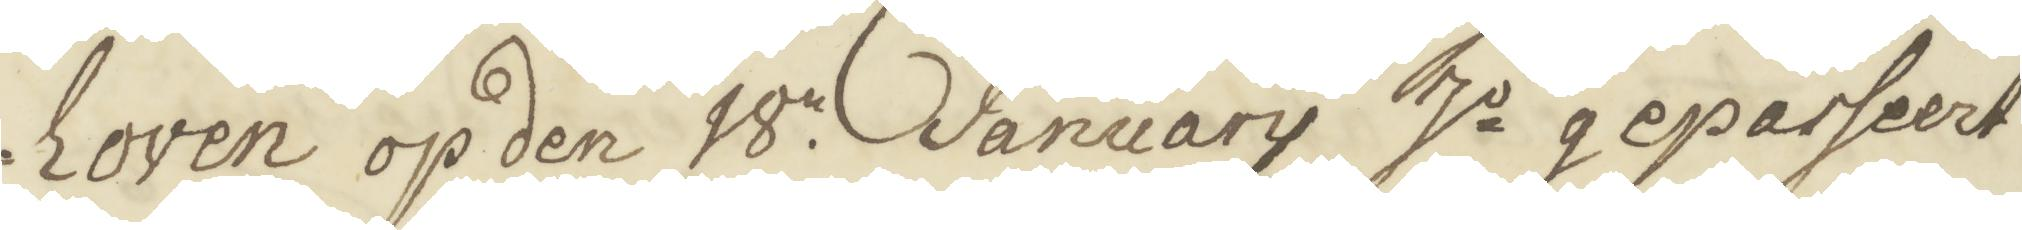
hoven op den 18.n Ianuarij J=o gepasseert
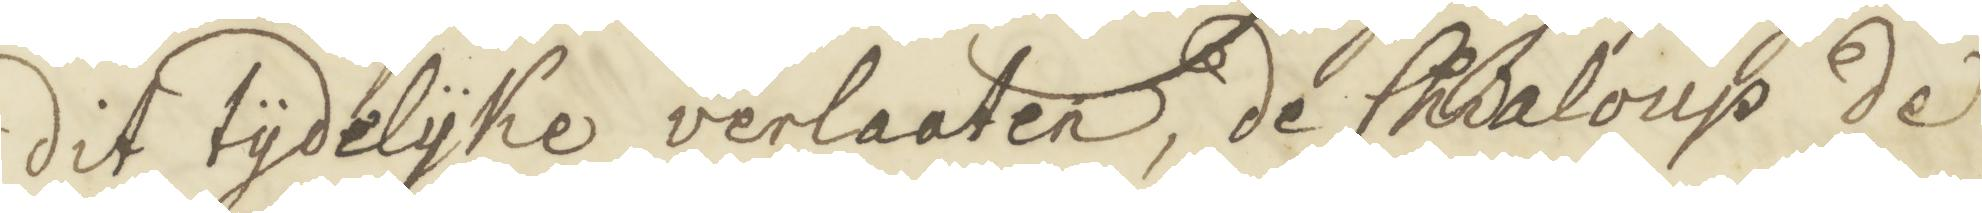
dit tijdelijke verlaaten, de chialoup de
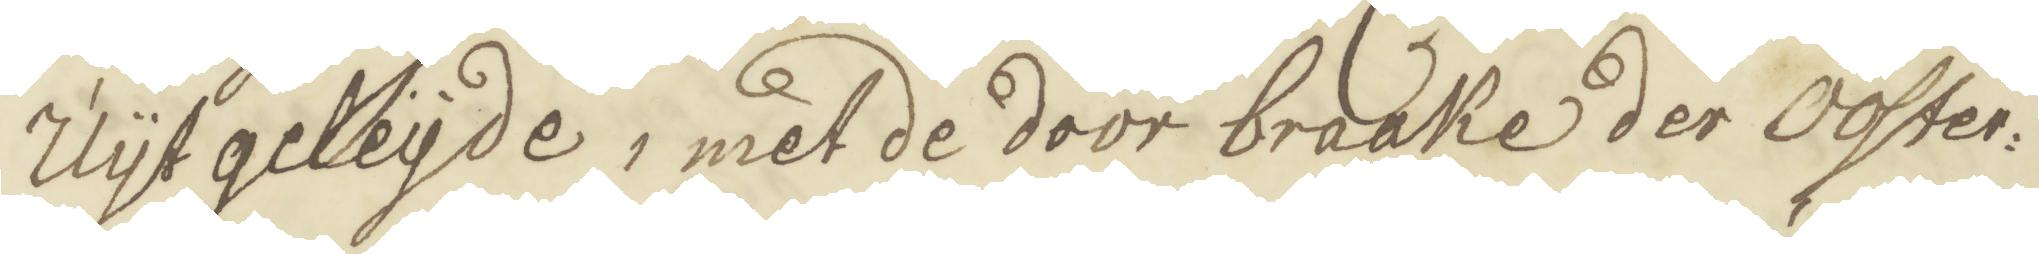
Uijtgeleijde, met de door braake der Ooster=
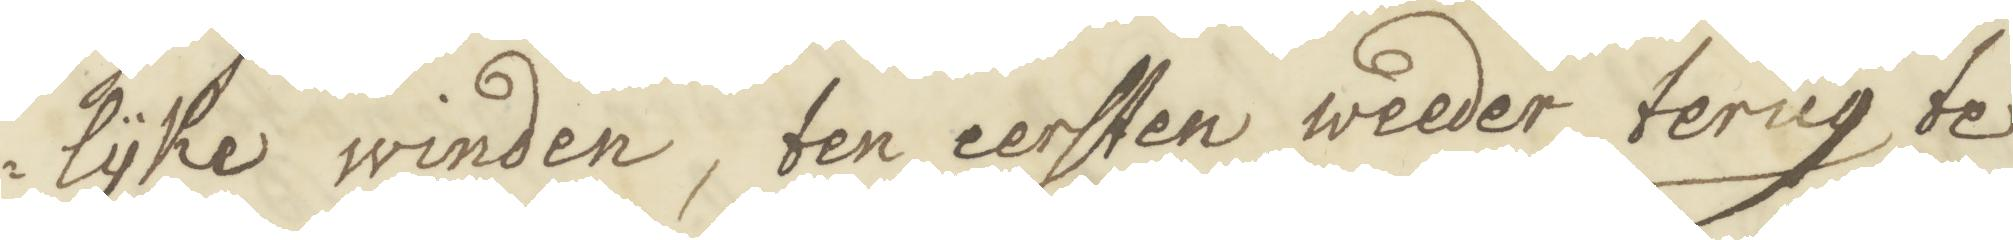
= lijke winden, ten eersten weeder terug te
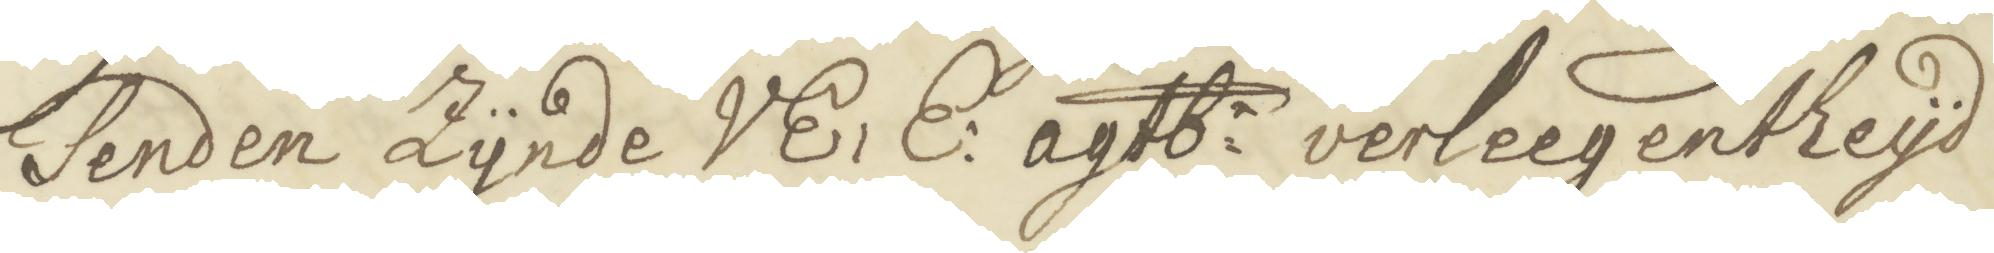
senden zijnde VE: E: agtb:r verleegentheijd
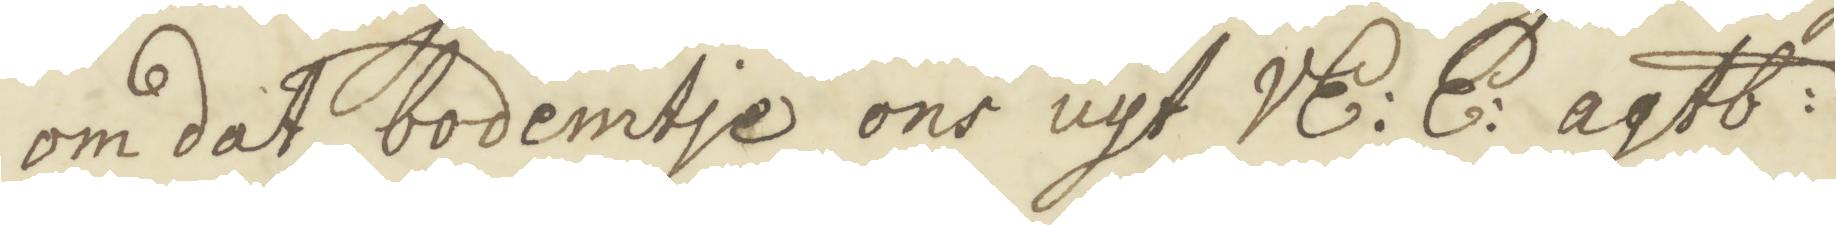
om dat bodemtje ons uijt VE: E: agtb:
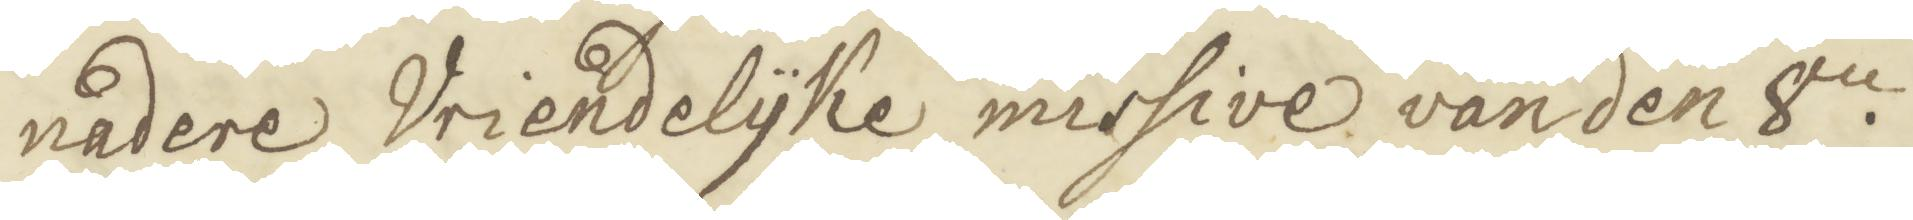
nadere Vriendelijke missive van den 8.n
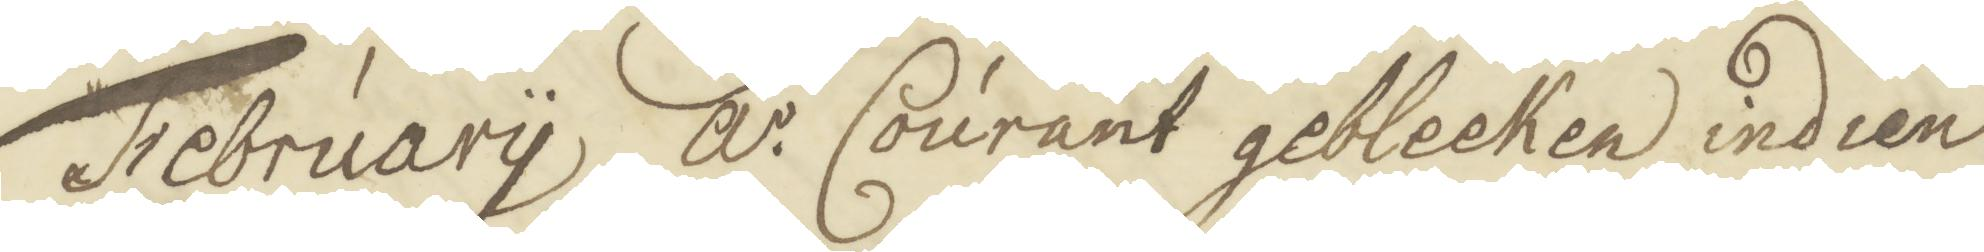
Februarij, a:o Courant gebleeken indien
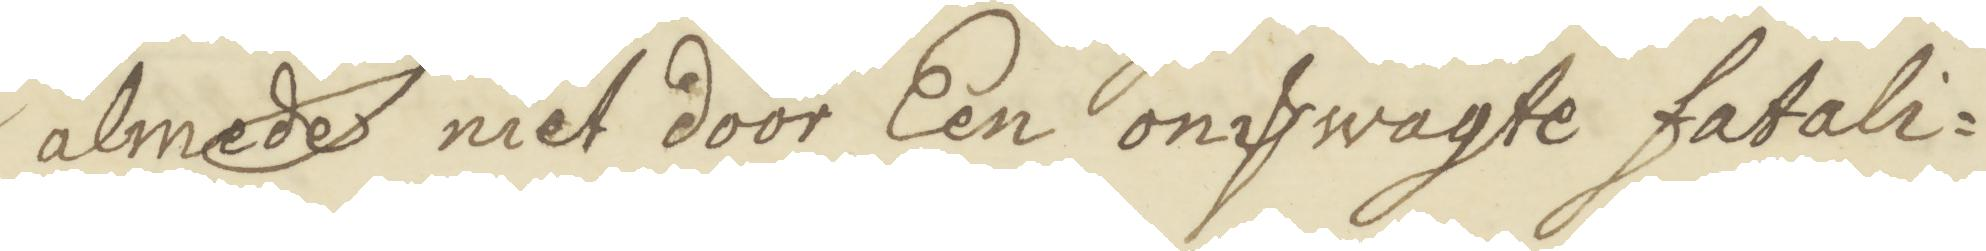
almede niet door Een onverwagte fatali=
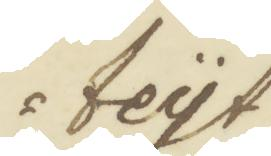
„teijt
